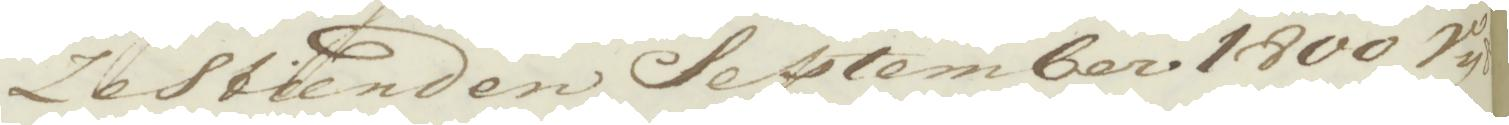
zestienden September 1800 vy
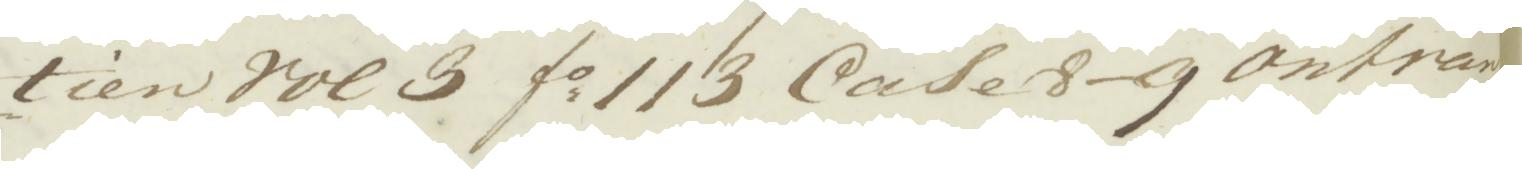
=tien Vol 3 f=o 113 Case 8-9 ontvan
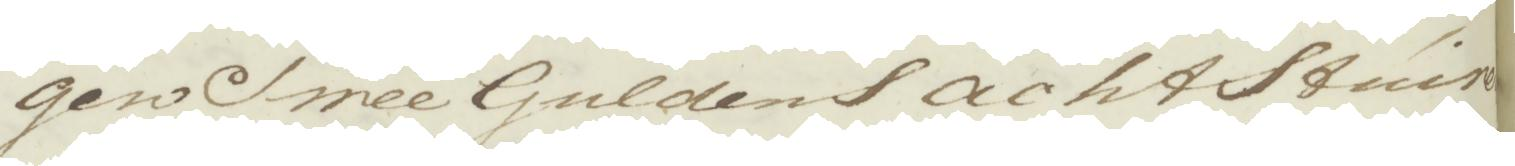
gen Twee Guldens acht stuive
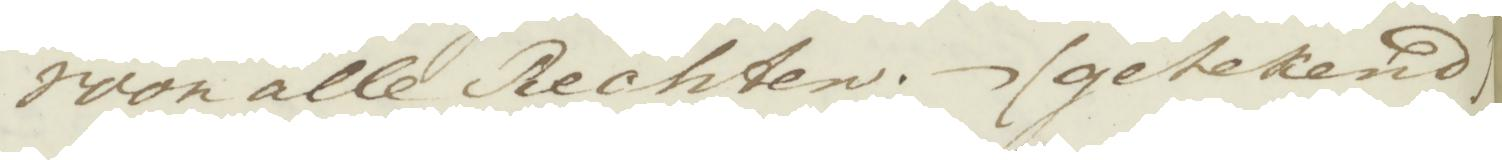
voor alle Rechten. (getekend)
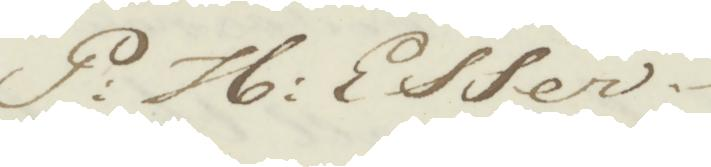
P: H: Esser.
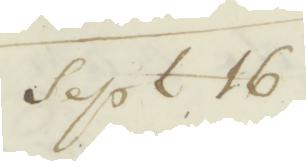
Sept 16
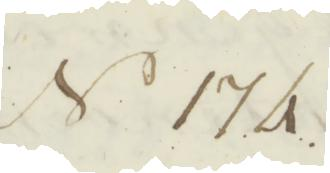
No 174.
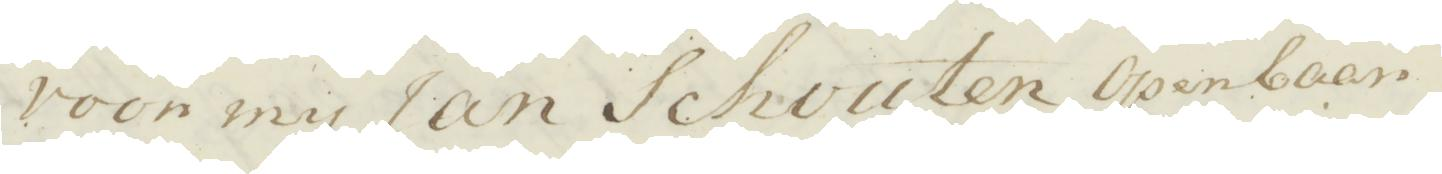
voor my Jan Schouten, Openbaar
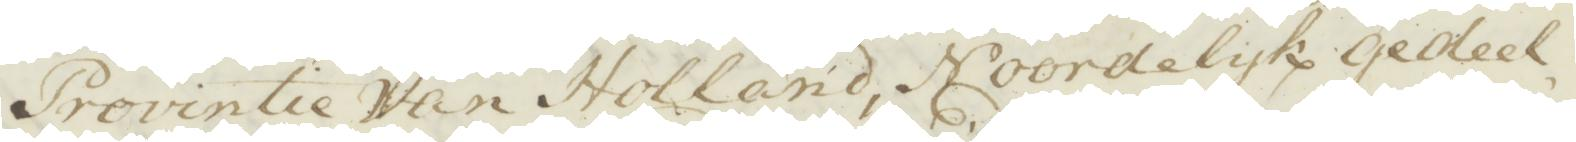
Provintie van Holland, Noordelyk gedeel,
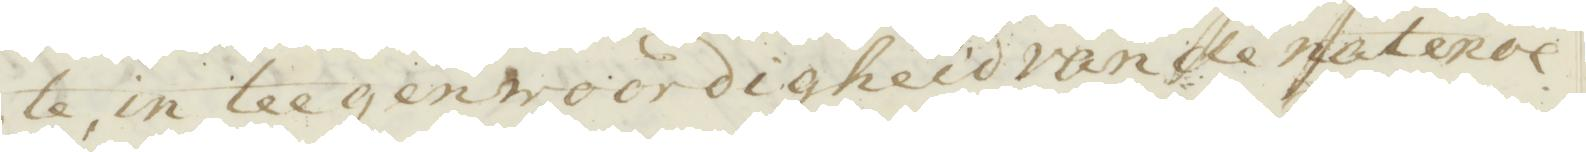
,,te, in teegenwoordigheid van de natenoe
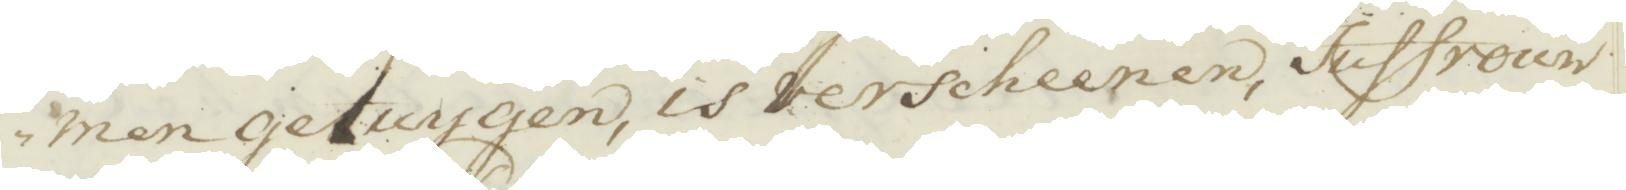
„men getuygen, is verscheenen, Juffrouw
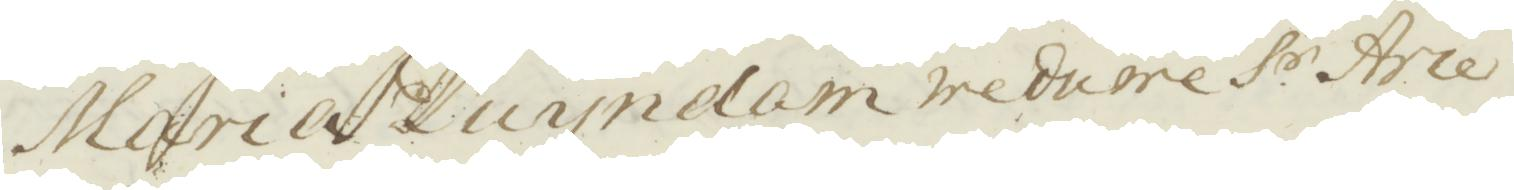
Maria Duyndam weduwe s.r Arie
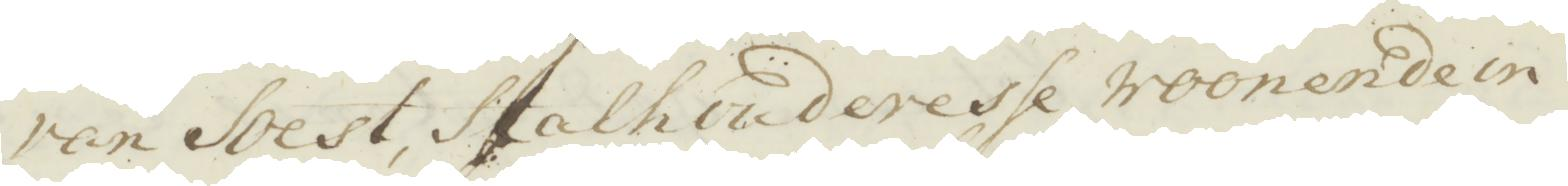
van Soest, Stalhouderesse, woonende in
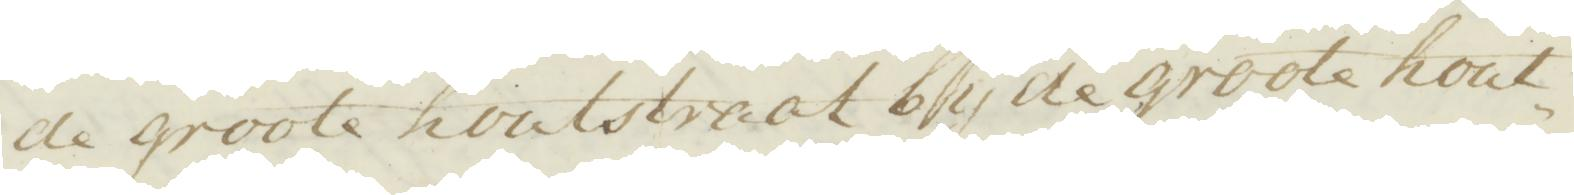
de groote houtstraat by de groote hout„
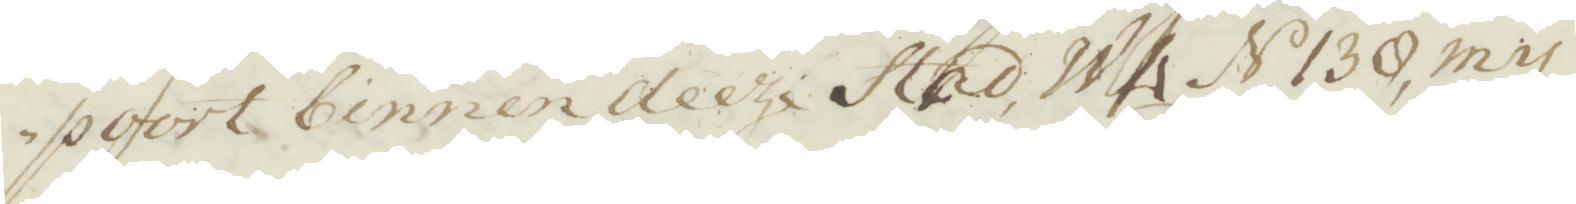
„poort binnen deeze Stad, W4 N138, my
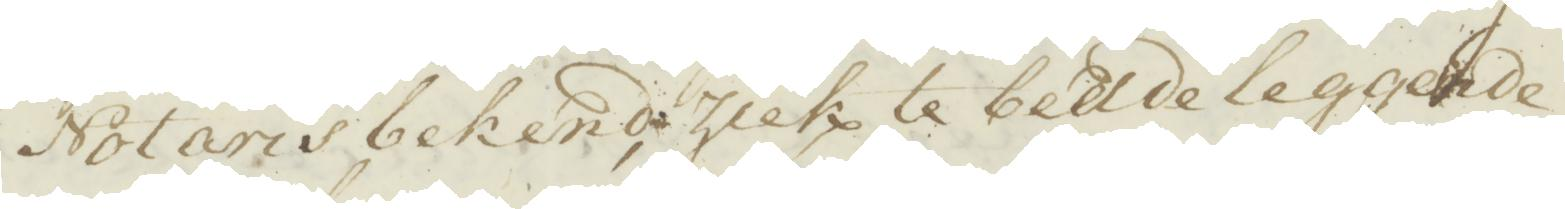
Notaris bekend, ziek te bedde leggende
